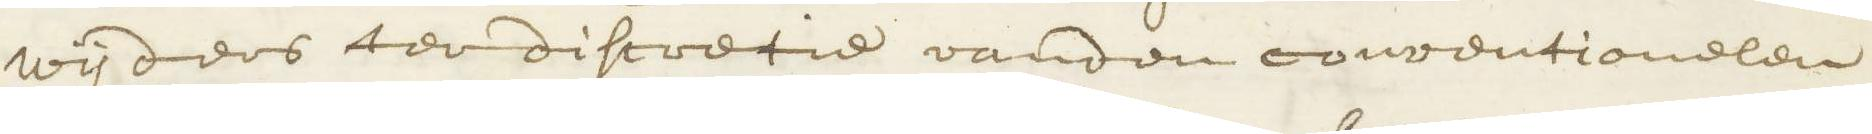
wijders ter discretie vanden conventionelen
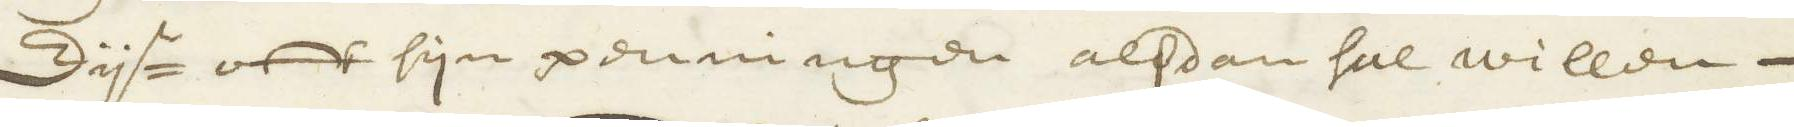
Eij=r oft sijn penningen alsdan sal willen —
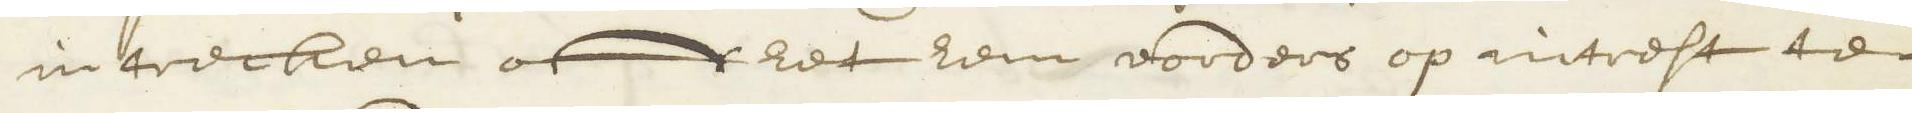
in trecken off het hem vorders op intrest te
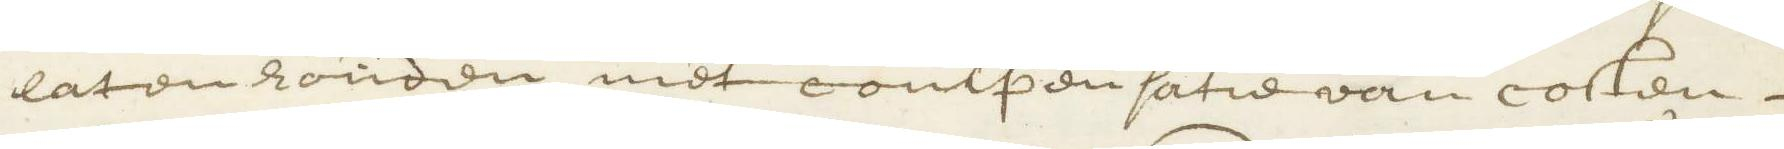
laten houden met compensatie van costen
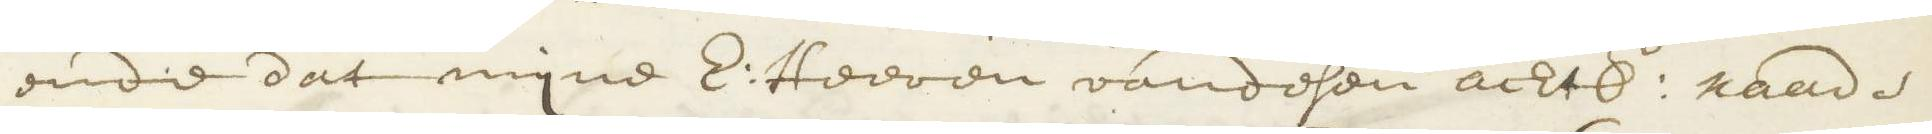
ende dat mijne E: Heeren van desen achtb: raads
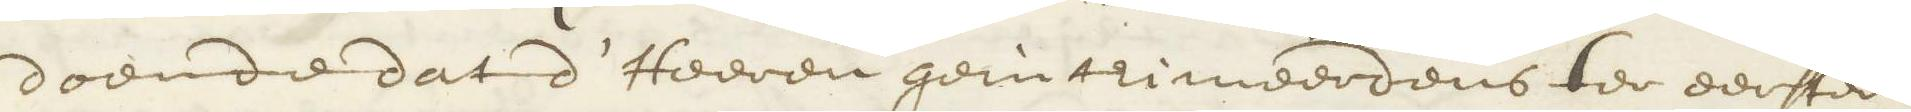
doende dat d’ Heeren geinthimeerdens ter eerster
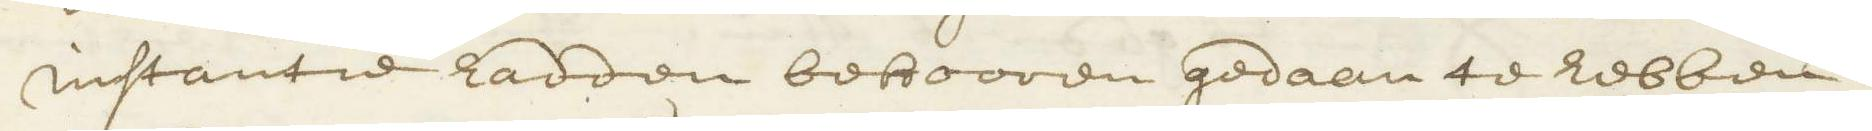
instantie hadden behooren gedaan te hebben
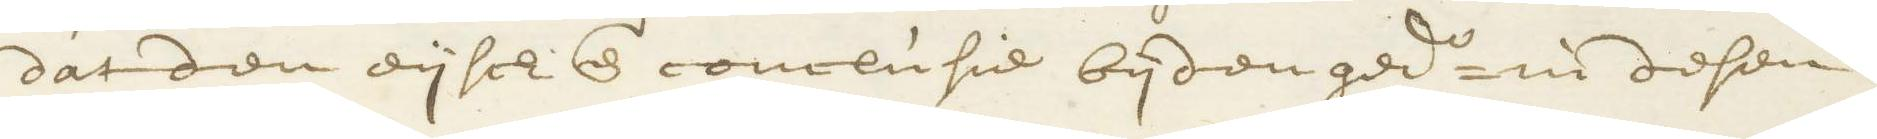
dat den eijsch ende conclusie bij den ged=e in desen
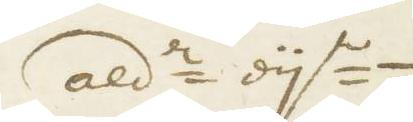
ald=r eij=r -
